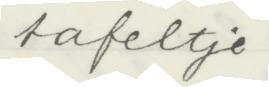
tafeltje
